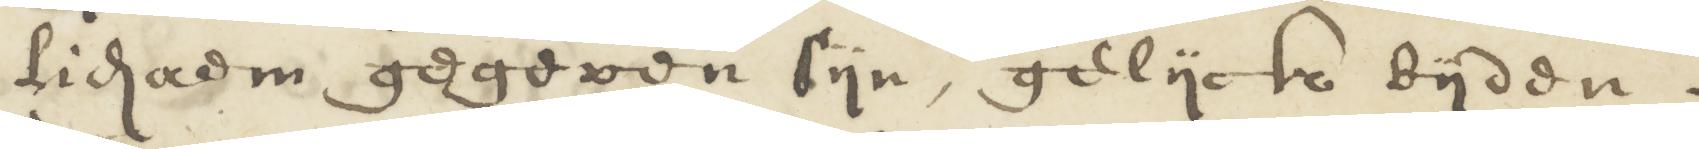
lichaem gegeven sijn, gelijck bijden
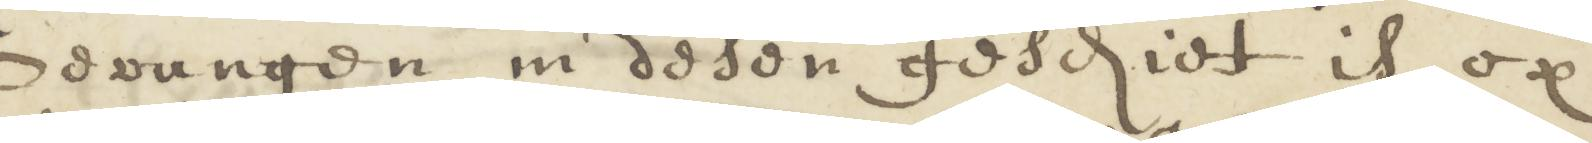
Gevangen in desen geschiet is
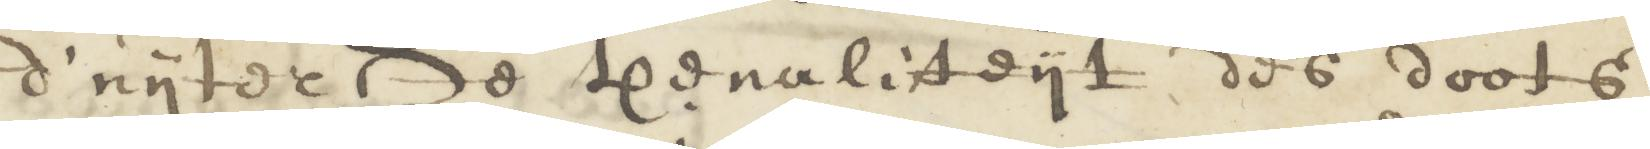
d’uijterste penaliteijt des doots
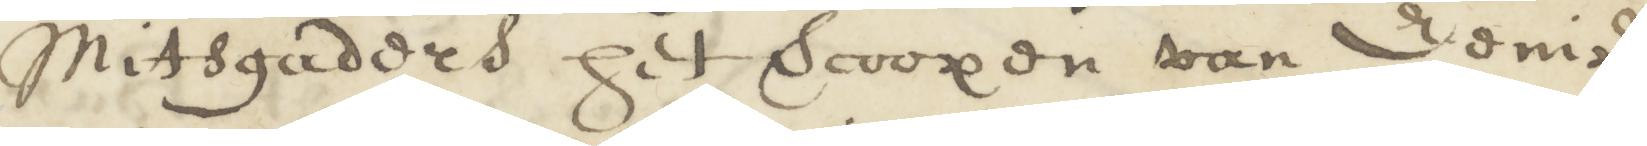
mitsgaders het vercoopen van Eenich
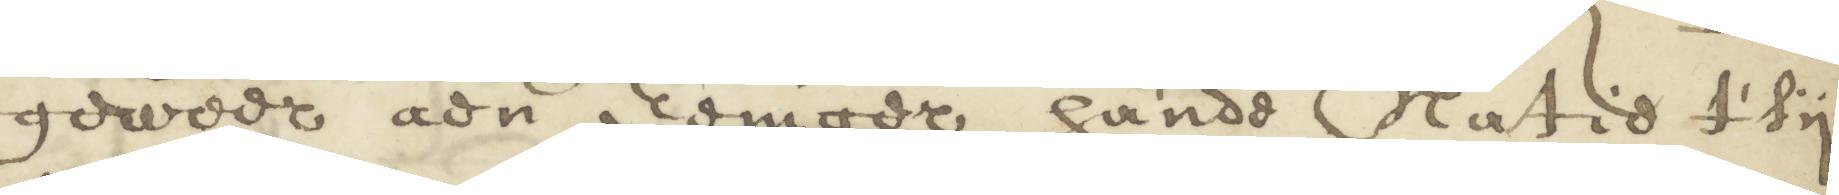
geweer aen Eeniger hande Natie t' sij
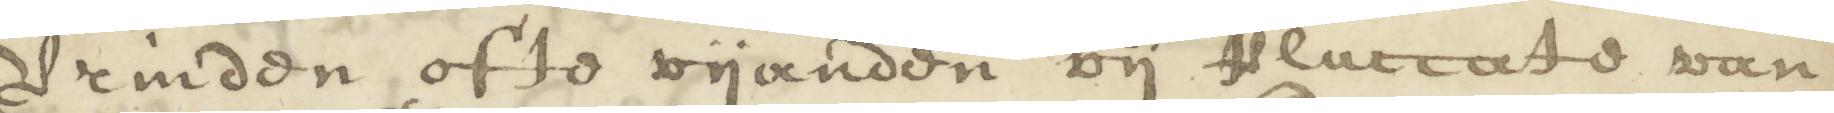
vrinden ofte vijanden bij placcate van
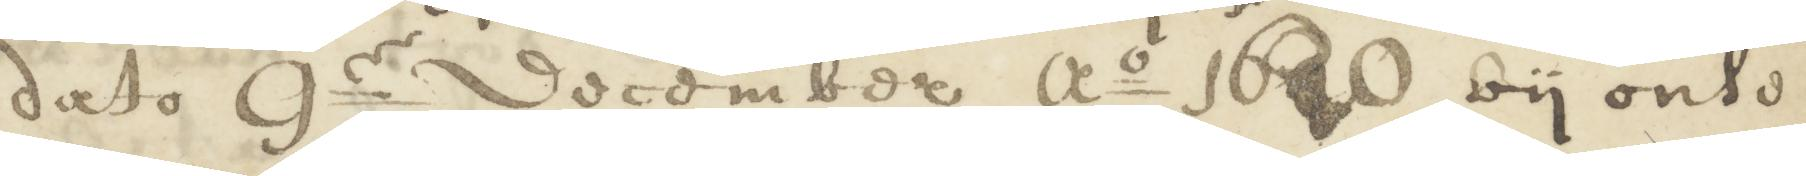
dato 9=' December a=o 1640 bij onse
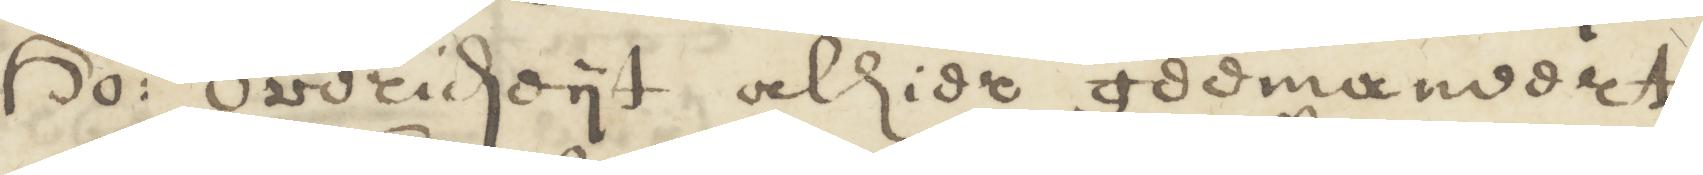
ho: overicheijt alhier geemaneert
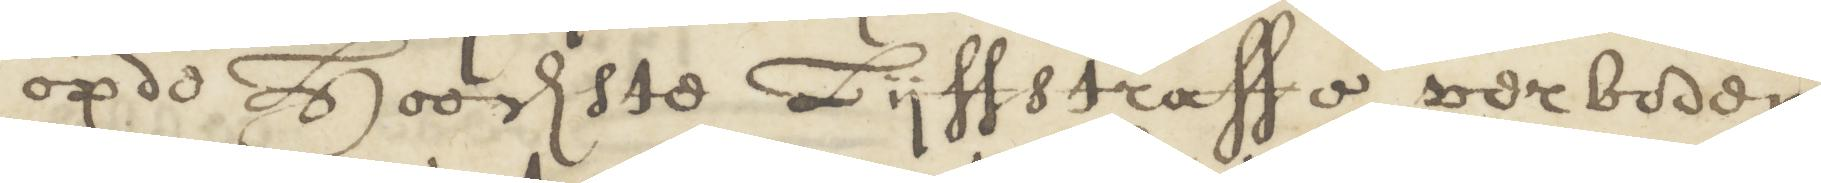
op de Hoochste Lijffstraffe verboden
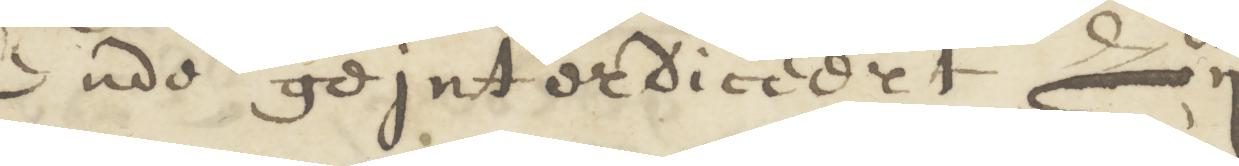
Ende gejnterdiceert zij ./.
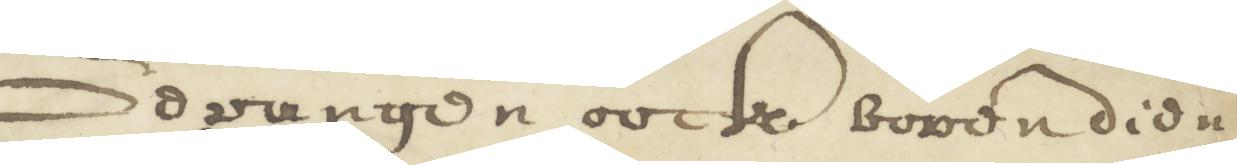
Maer dat hij Gevangen oock bovendien
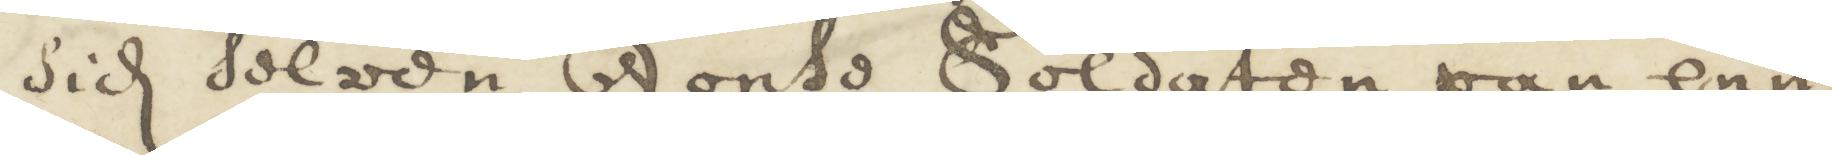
sich selven ende onse Soldaten van sijn
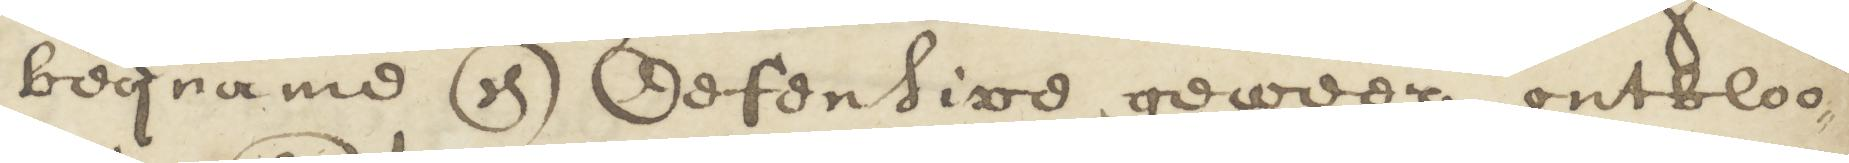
bequame ende oefensive geweer ontbloo„
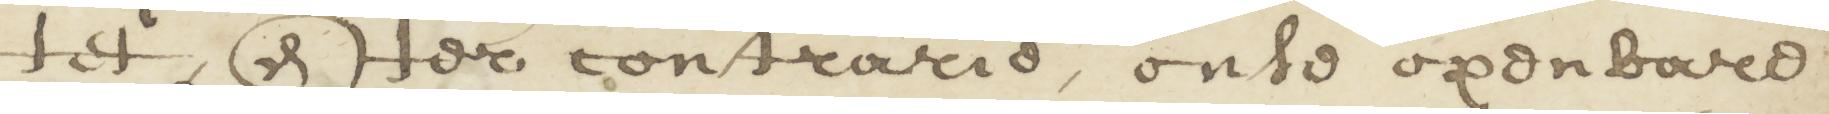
tet, ende ter contrarie, onse openbare
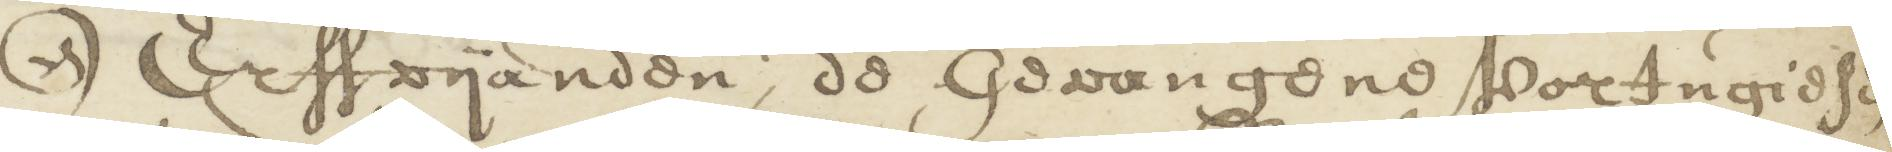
ende Erffvijanden, de Gevangene portugiesen
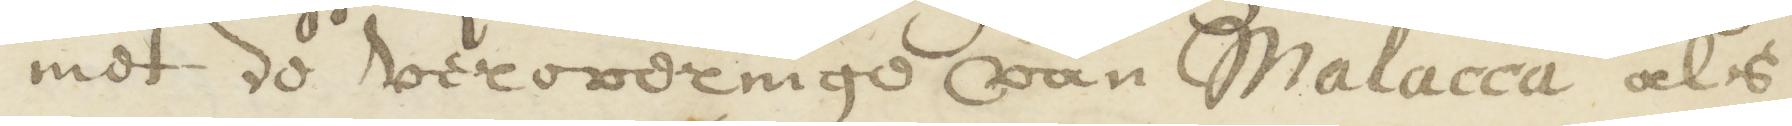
met de veroveringe van Malacca als
